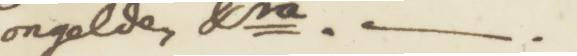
ongelden &=ra. — .
